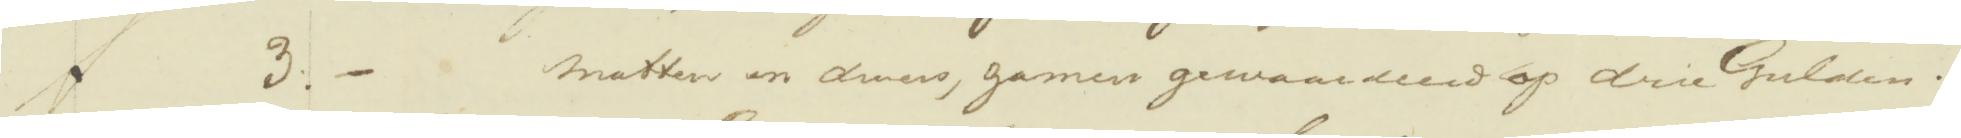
f 3: - matten en divers, zamen gewaardeerd op drie Gulden.
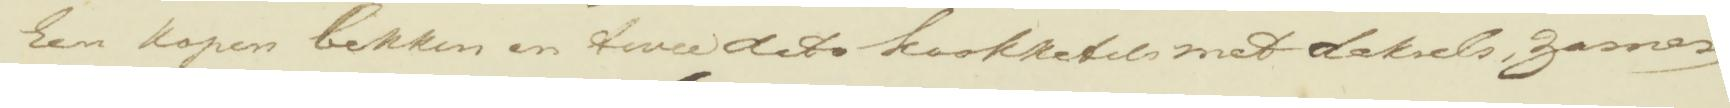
Een koper bekken en twee dito kookketels met deksels, zamen
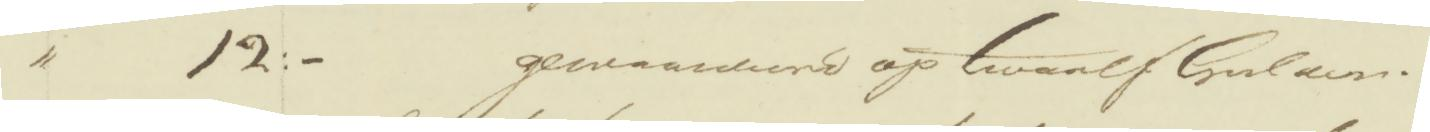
„ 12:- gewaardeerd op twaalf Guldens.
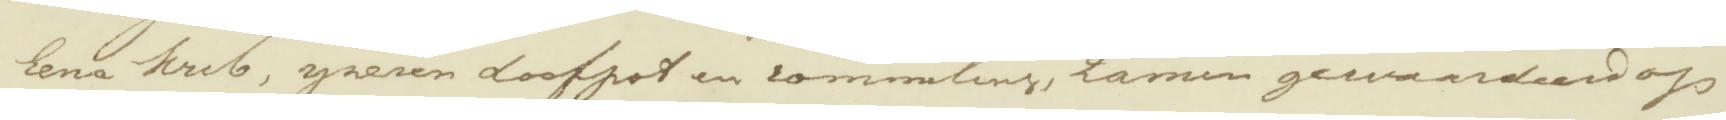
Eene krib, yzeren doofpot en rommeling, zamen gewaardeerd op
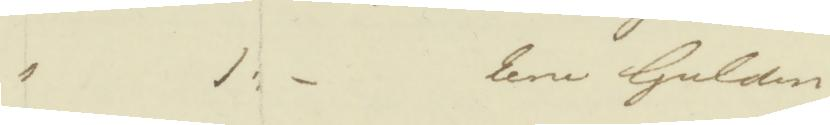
„ 1: - Eene Gulden
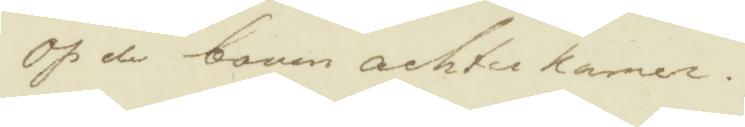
Op de boven achterkamer.
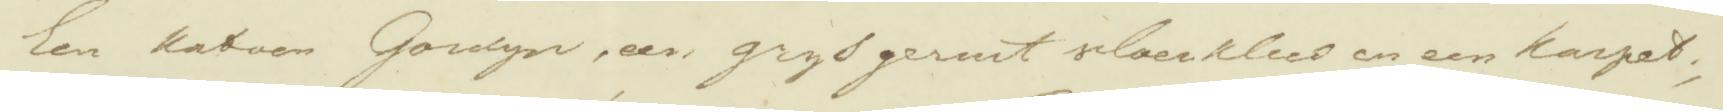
Een katoen Gordyn, een grys geruit vloerkleed en een karpet„
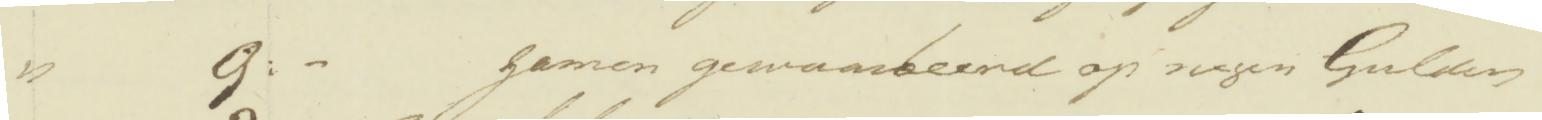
„ 9: - zamen gewaardeerd op negen Gulden
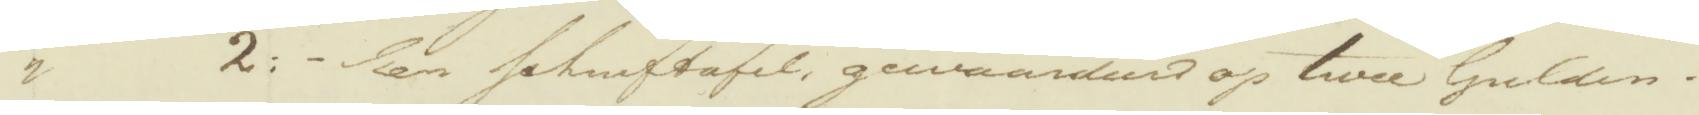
„ 2: - Een schuiftafel, gewaardeerd op twee Gulden
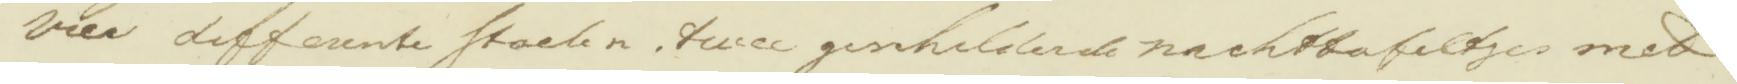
vier differente stoelen, twee geschilderde nachttafeltjes met
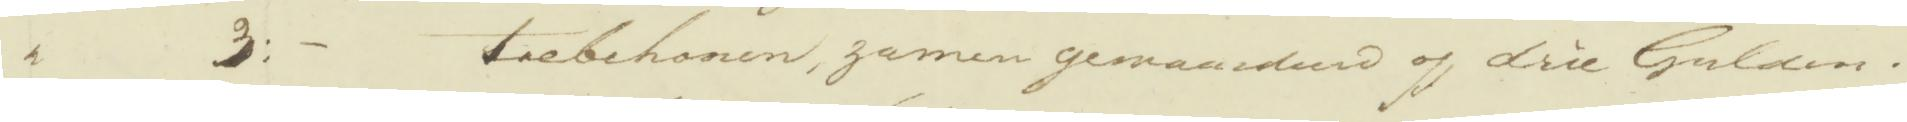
„ 3: - toebehoren, zamen gewaardeerd op drie Gulden.
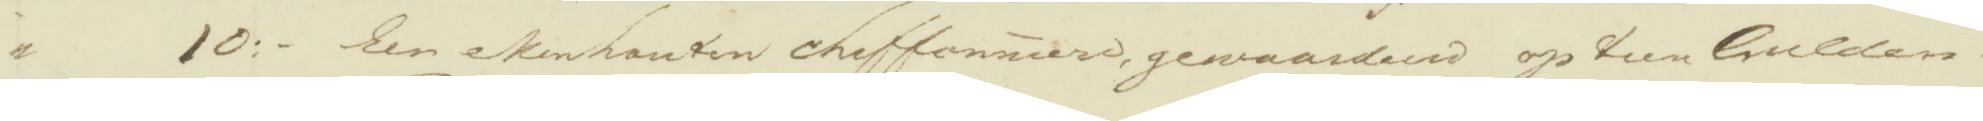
„ 10:– Een ekenhouten chiffonnìere, gewaardeerd op tien Gulden
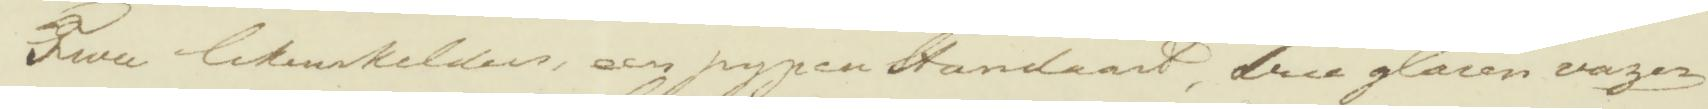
Twee likeurkelders, een pypen standaard, drie glazen vazen
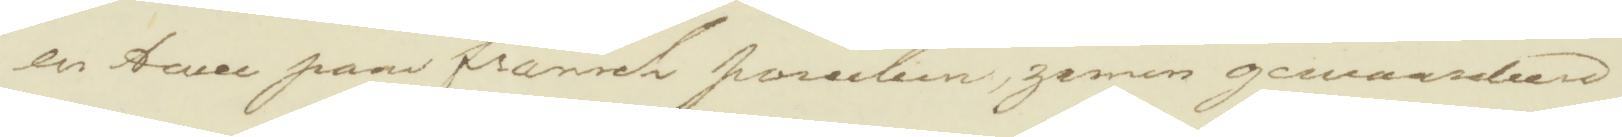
en twee paar fransch porcelein, zamen gewaardeerd
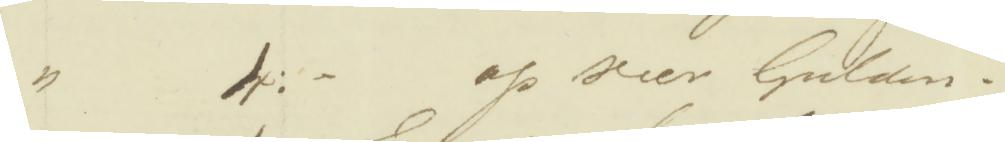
„ 4: - op vier Gulden.
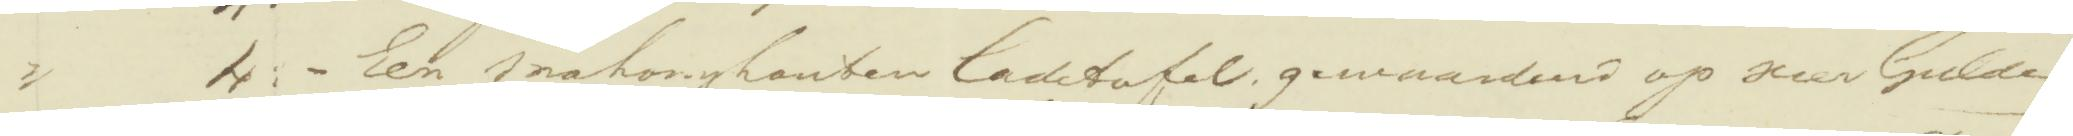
„ 4: - Een mahonyhouten ladetafel, gewaardeerd op vier Gulden
